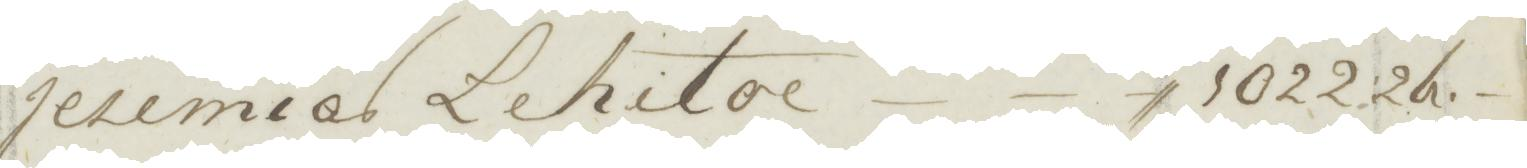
Jeremias Lehitoe — — –„ 1022:24. —
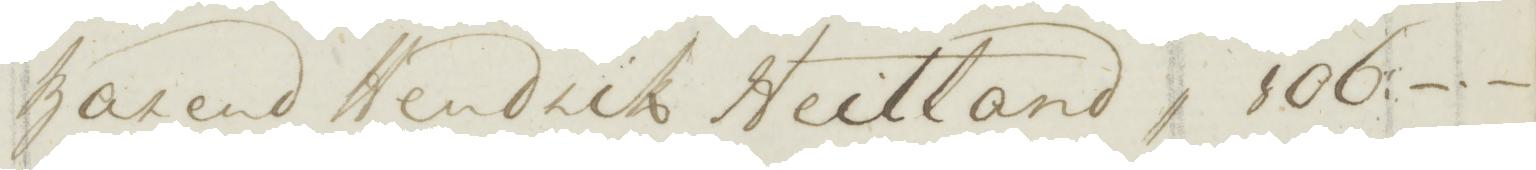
Barend Hendrik Heitland „ 106: — . —
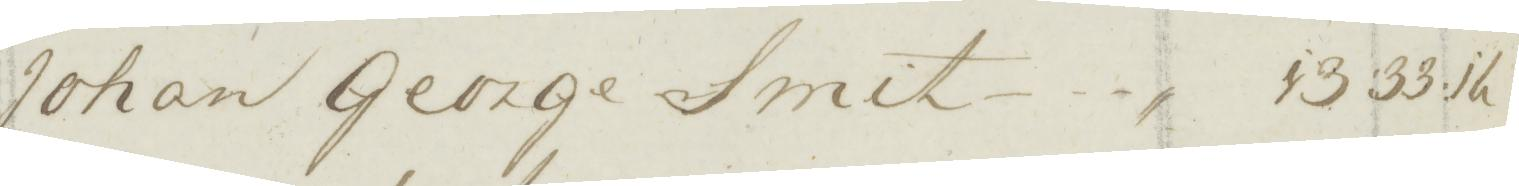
Johan George Smit — - - „ 13:33:14
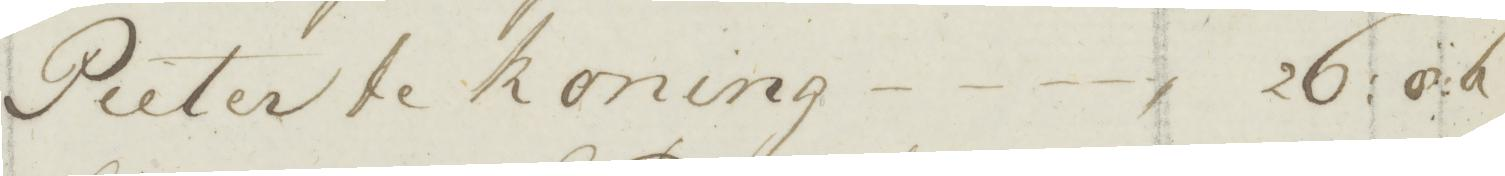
Pieter te koning – – – – -„ 26: 8:4
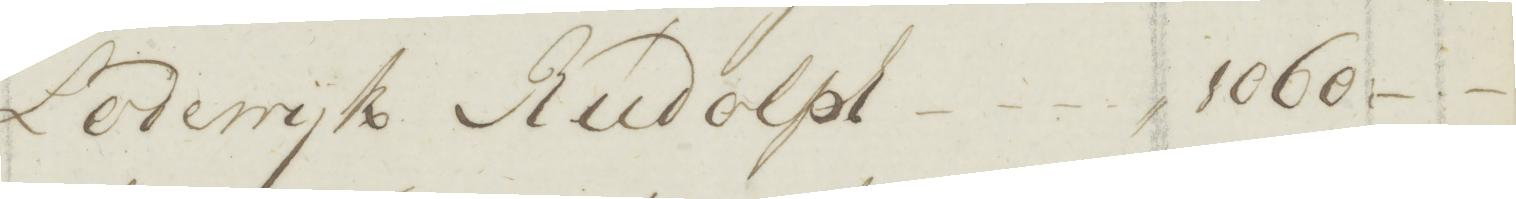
Lodewijk Rudolph – – – - „ 1060: — . —
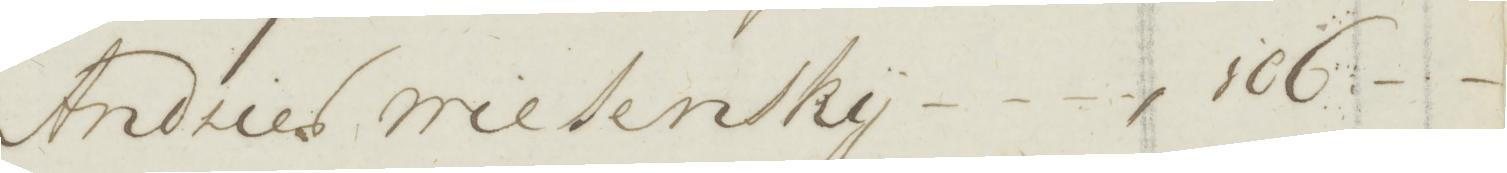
Andries wiesenskij – – – -„ 106: — . —
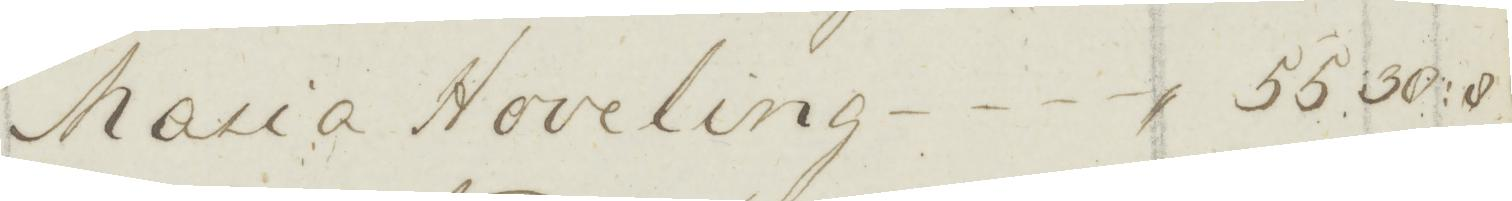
Maria Hoveling – – – – „ 55:30:8
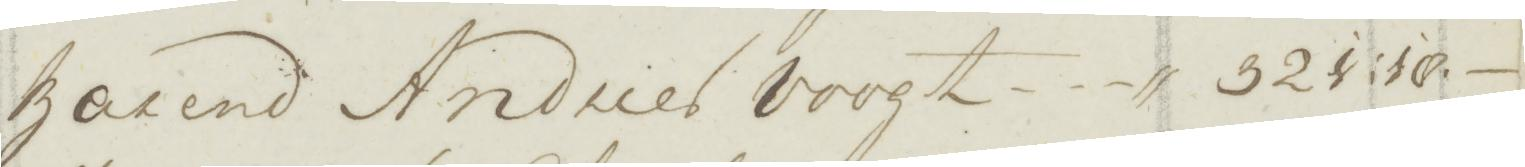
Barend Andries voogt – - – „ 321:18.—
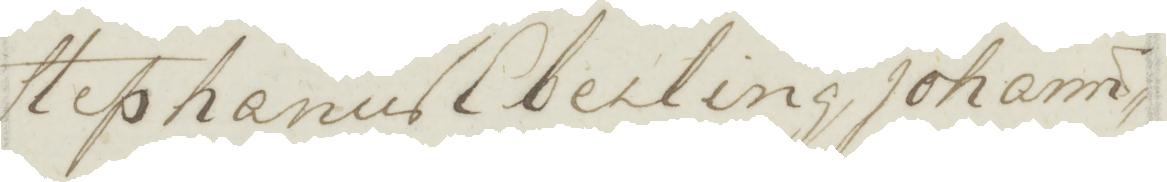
stephanus Eberling Johann„
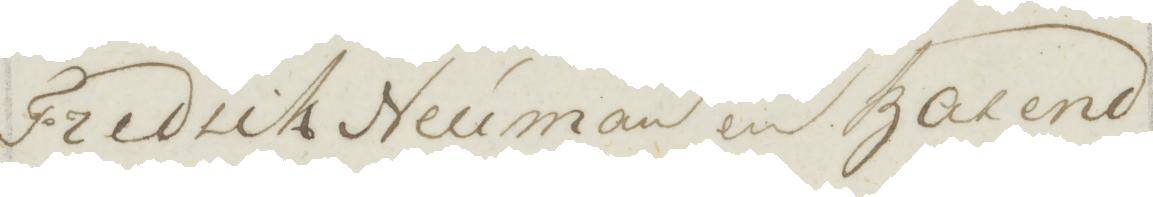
Fredrik Neuman en Barend
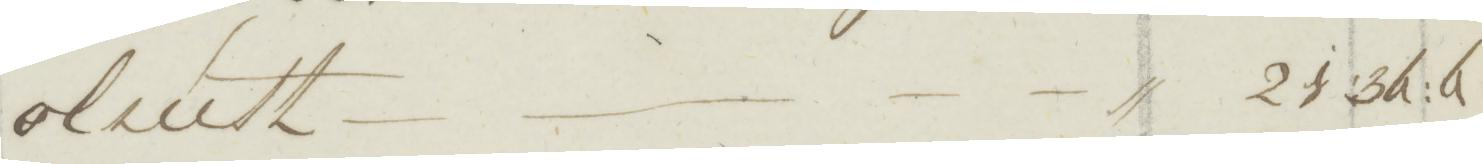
olrust — — — — „ 21:34:4
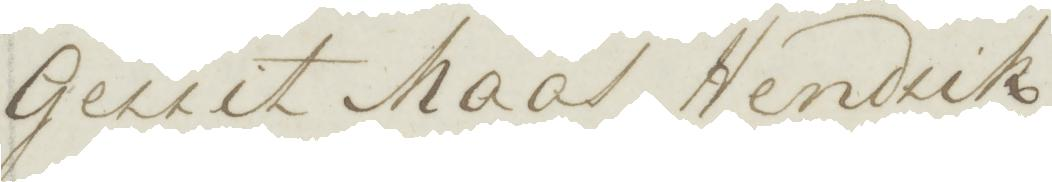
Gerrit Maas, Hendrik
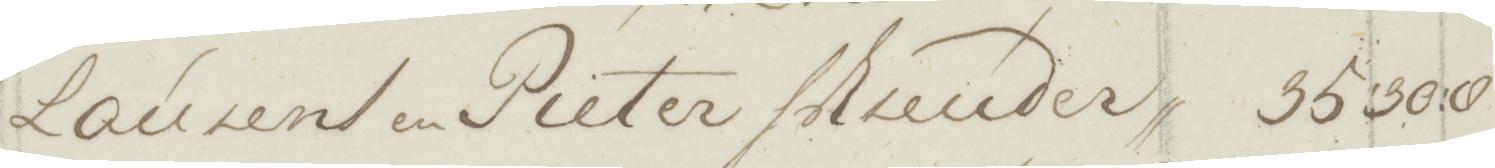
Laurens en Pieter schreuder „ 35:30:8
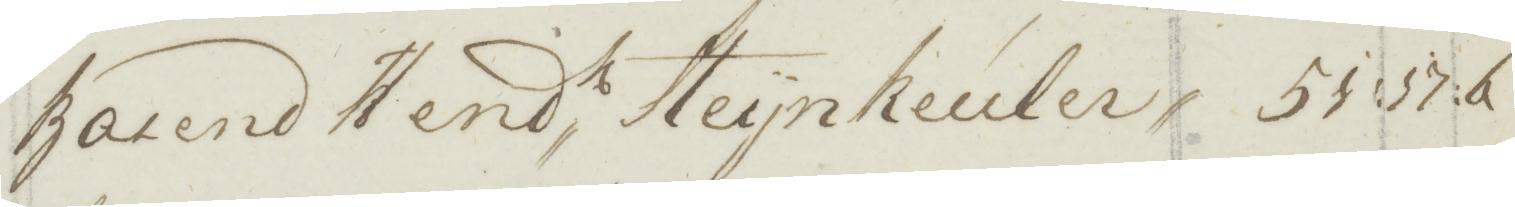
Barend Hend„k Steijnkeuler „ 51:17:4
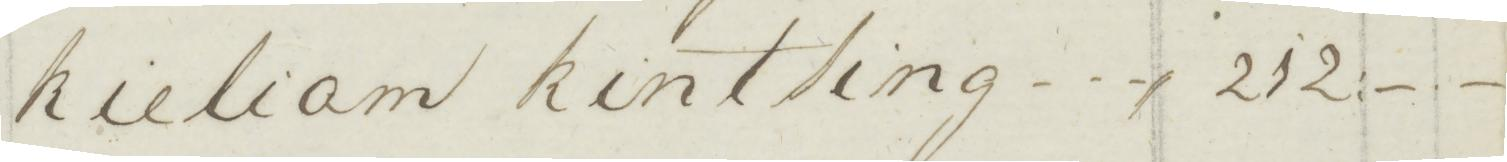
Kieliam Kintsing - - - „ 212: — . —
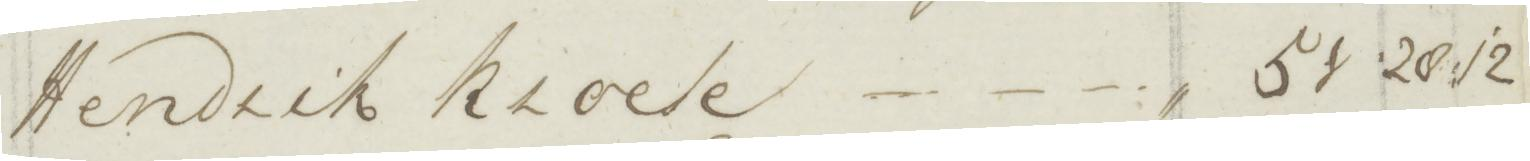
Hendrik Kroese — — — - „ 51:28:12
